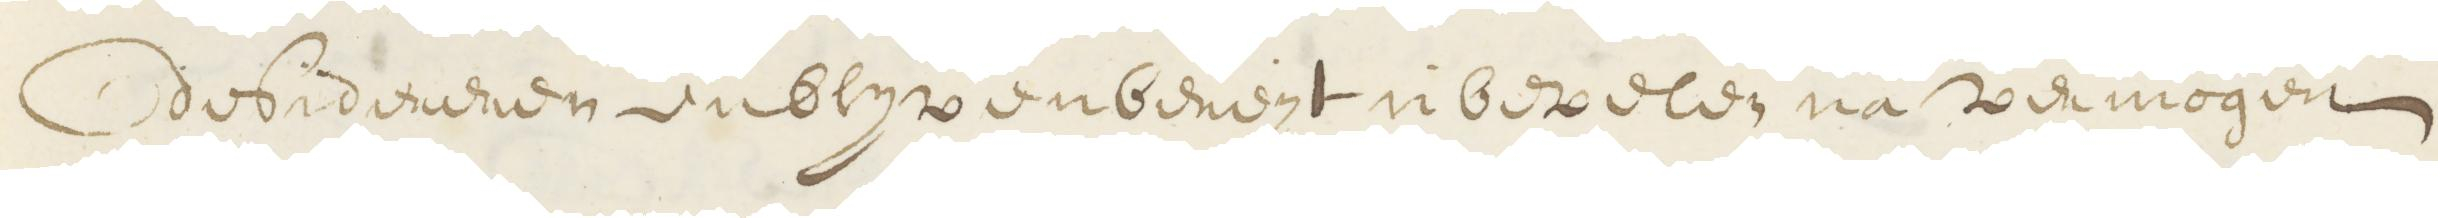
desidereren en blyven bereijt u bevelen na vermogen
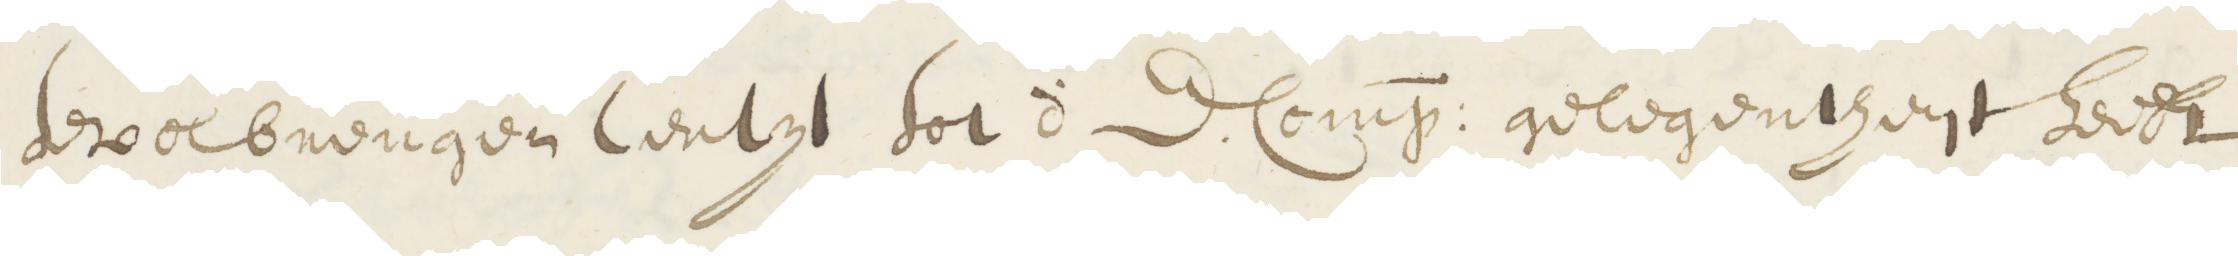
te volbrengen tertyt tot d’ E. Comp: gelegentheyt heeft
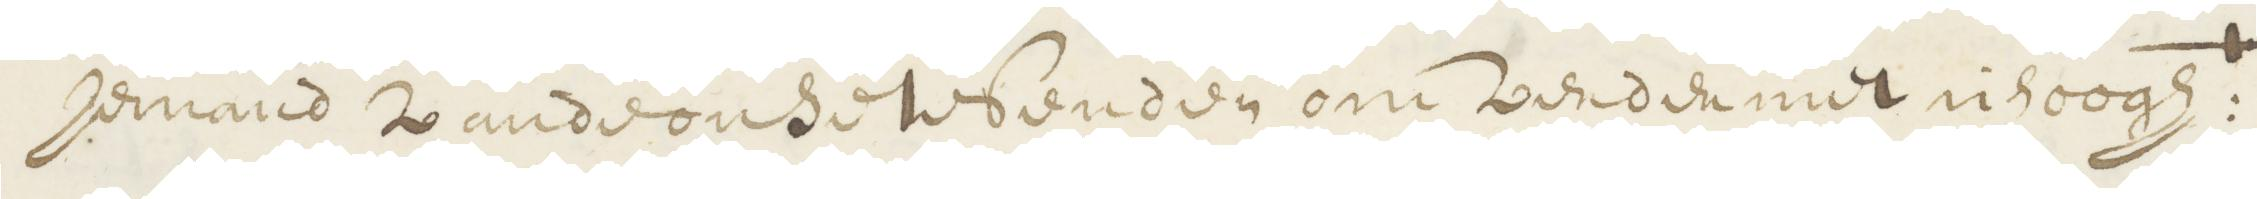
jemand van de onse te senden om verder met u hoogh:t
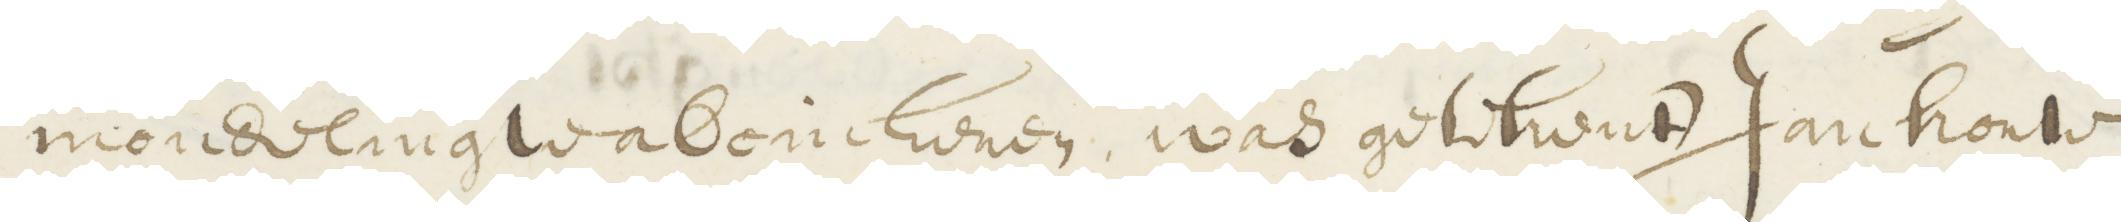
mondeling te aboucheren, was getekent Jan korte
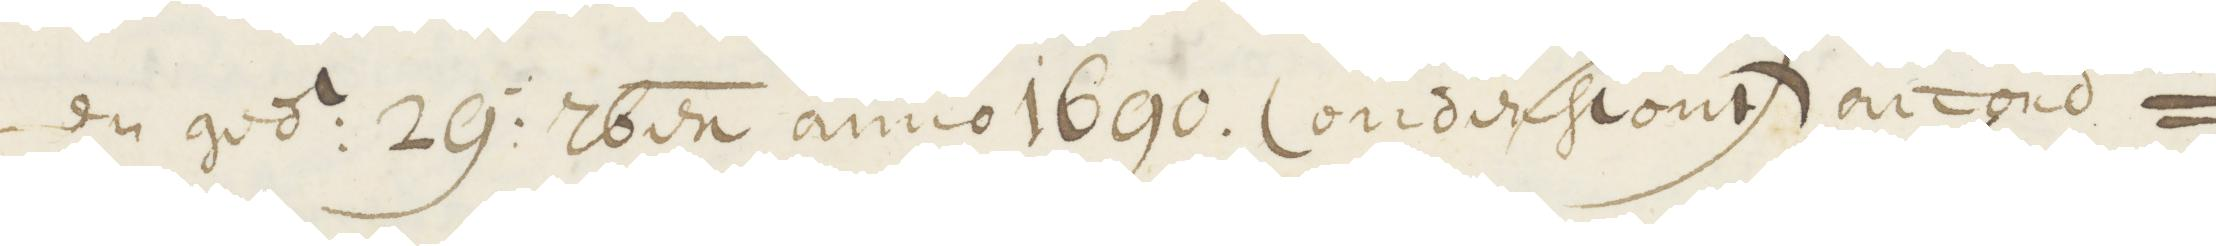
en ged:t 29:' 7ber anno 1690. (onderstont) accord=rt
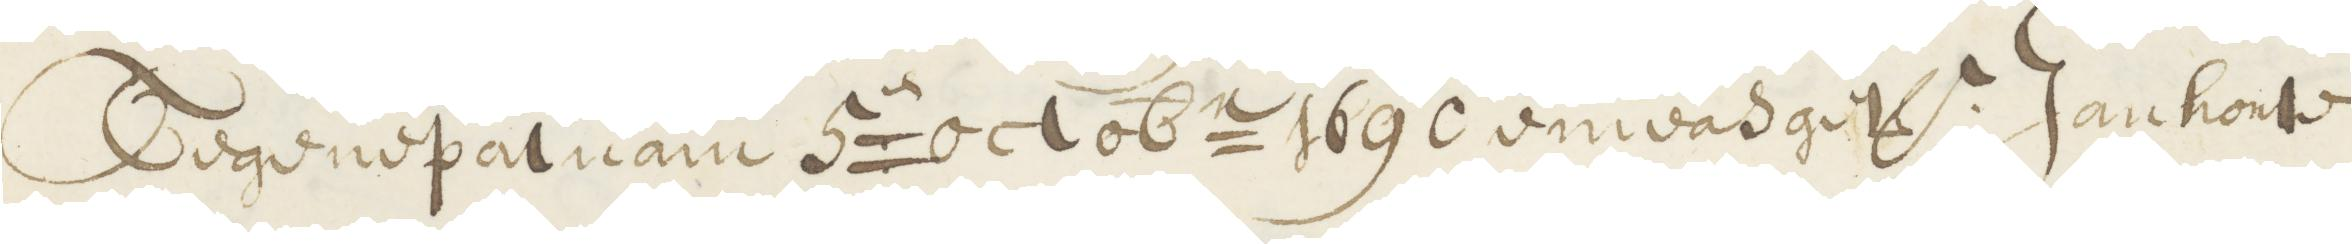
Te genepatnam 5=e octob=r 1690 en was geth:t Jan korte
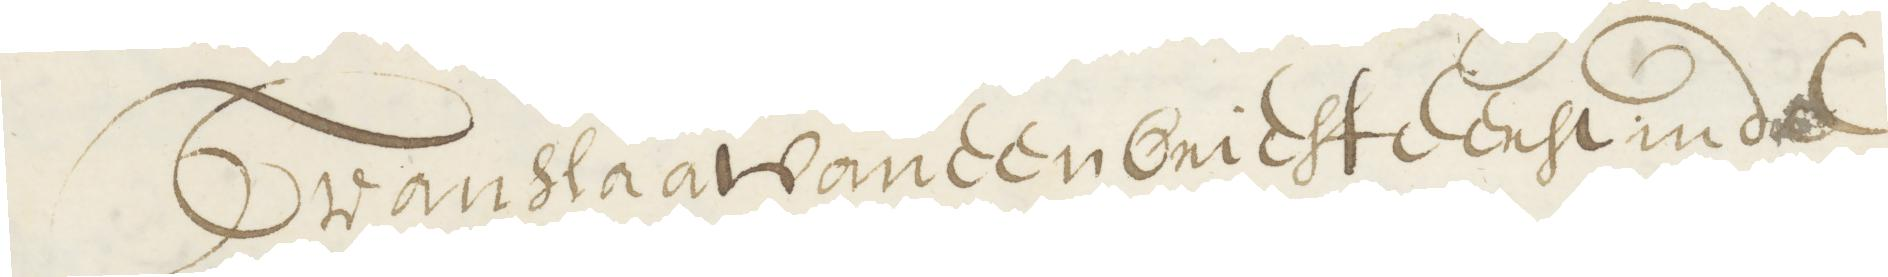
Translaat van een brieff Eerst in de
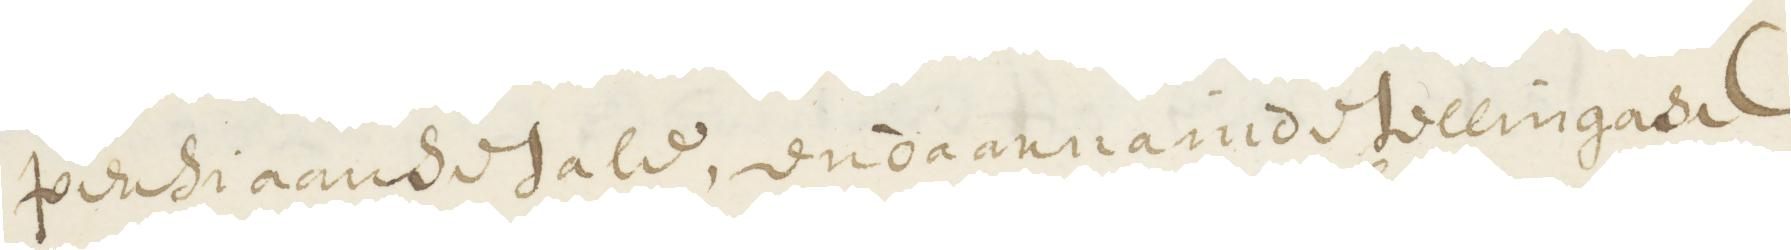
persiaanse tale, en daar na in de tellingase
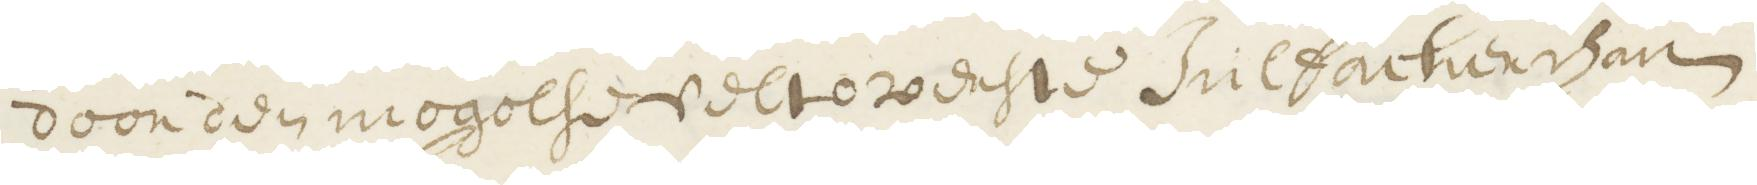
door den mogolse veltoverste Iulfackerchan
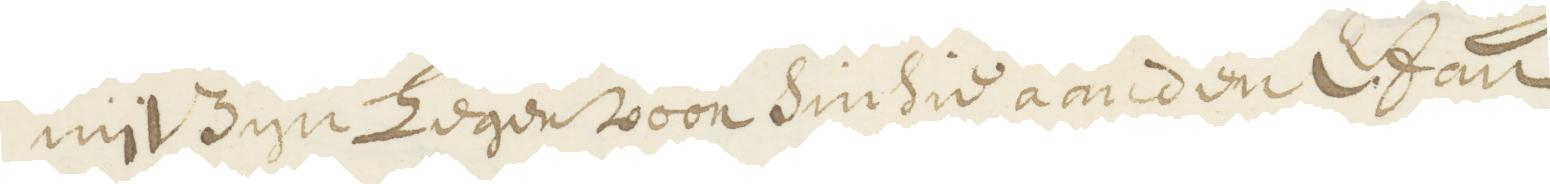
uijt zyn Leger voor sinsie aan den Efan
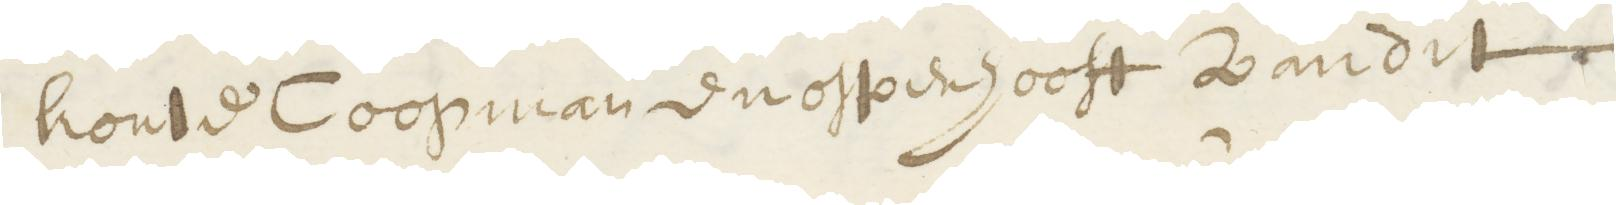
korte Coopman en opperhooft van dit.
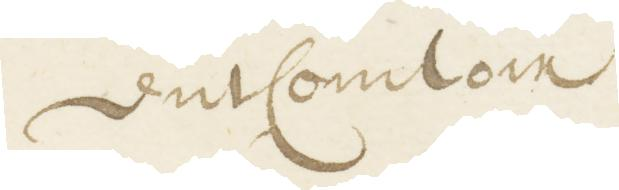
ent Comtoir
